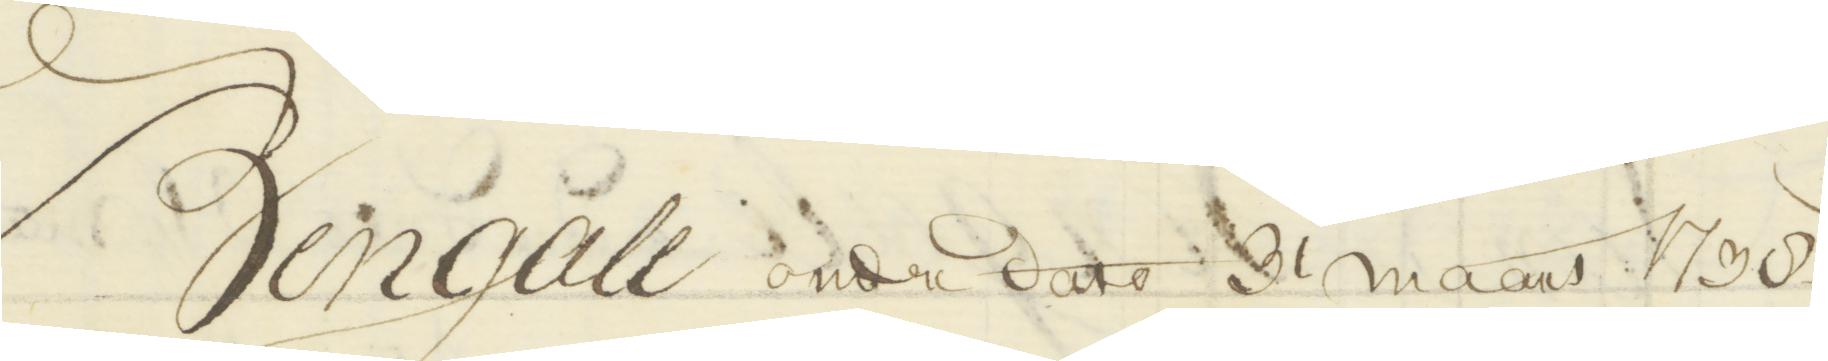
Van Bengale onder dato 31 maart 1738
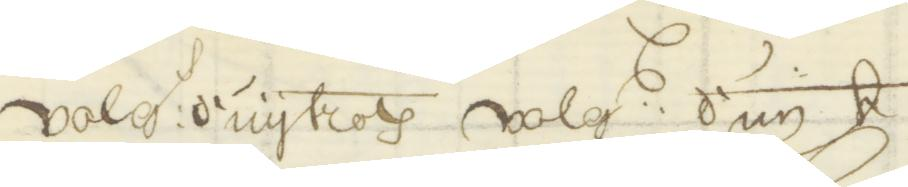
volg:s d’uijkos volg:s d'uijk
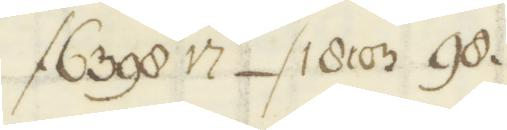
ƒ6398 17— ƒ18103 98.
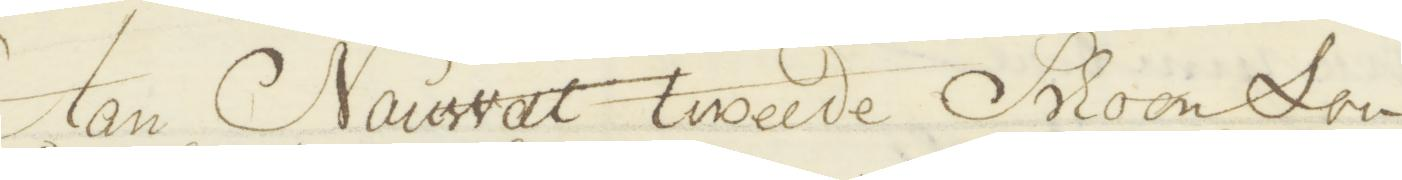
Aan Nauwat tweede Schoon San
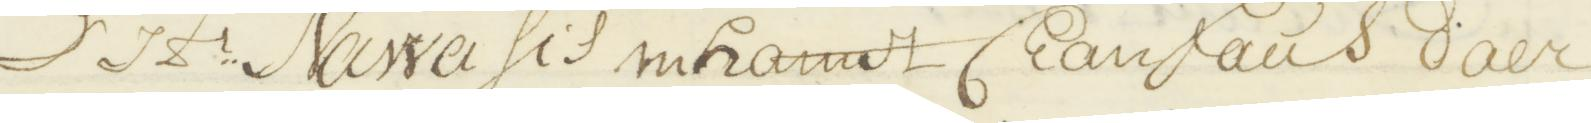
D I T„r Nawasis mhamet Chan faus daer
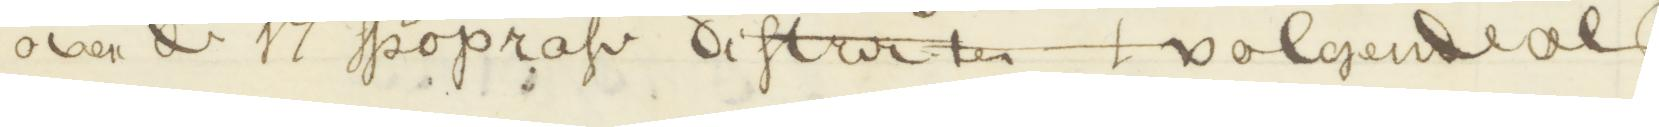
over de 17 spoprase districten t volgende als
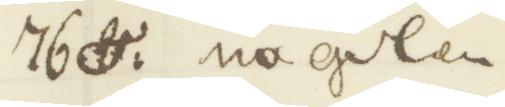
76 p:s nagelen
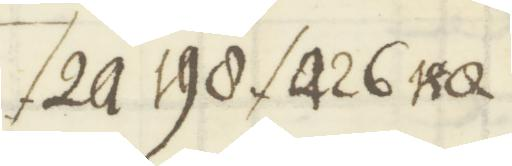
ƒ24 198 ƒ426 150.
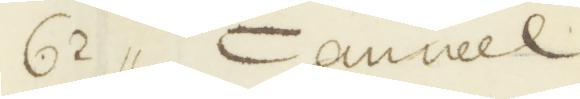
62 „ Canneel
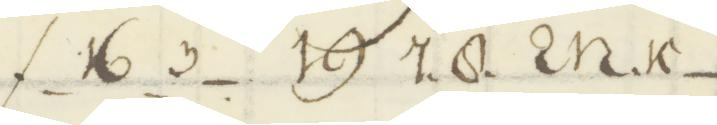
ƒ16 3 — 16 7. 8. 212. 15—
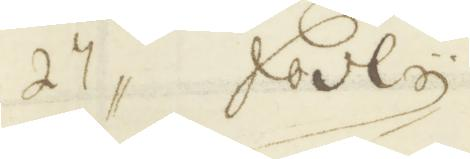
27„ foelij
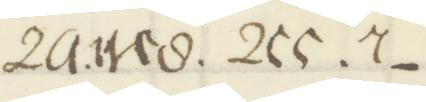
24.158. 255. 7–
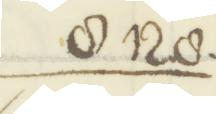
8 128
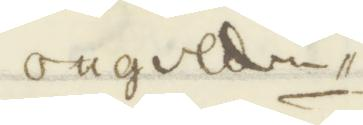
ongelden „
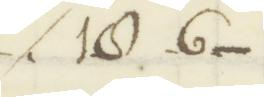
ƒ 18.6 —
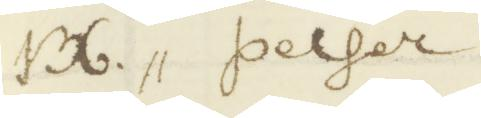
136. „ pelser
